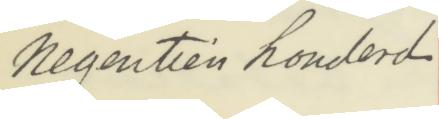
Negentien honderd
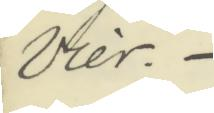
Vier.-
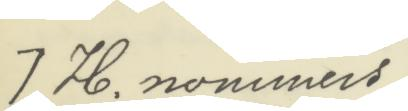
⁋ H. nommers
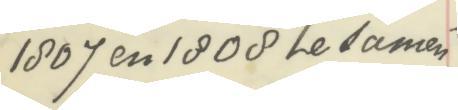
1807 en 1808 te samen
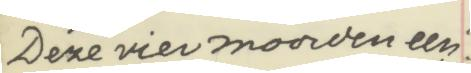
Deze vier woorden een
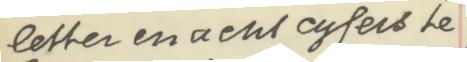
lester en acht cyfers te
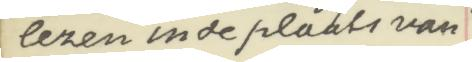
lezen in de plaats van
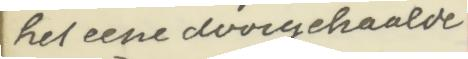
het eene doorgehaalde
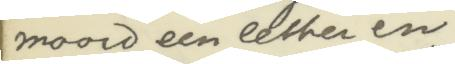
woord een letter en
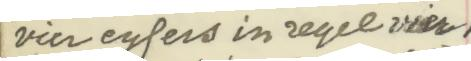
vier cyfers in regel vier
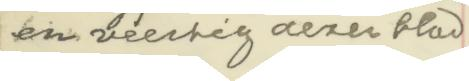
en veertig dezer blad
